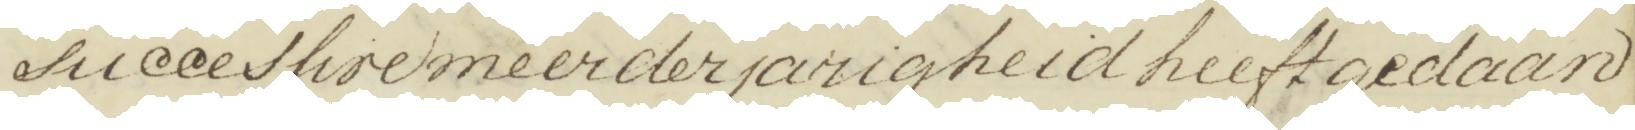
successive meerderjarigheid heeft gedaan
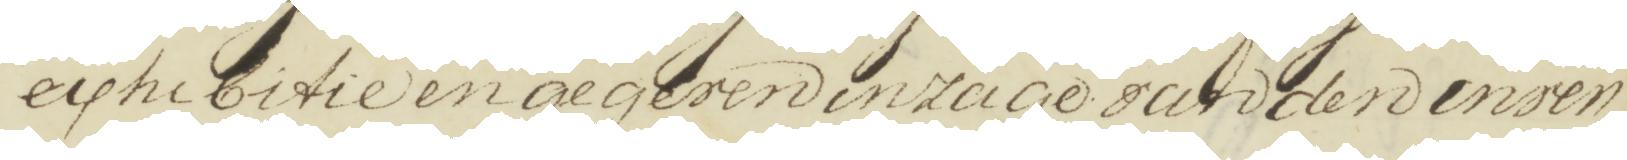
exhibitie en gegeven inzage aan den inven
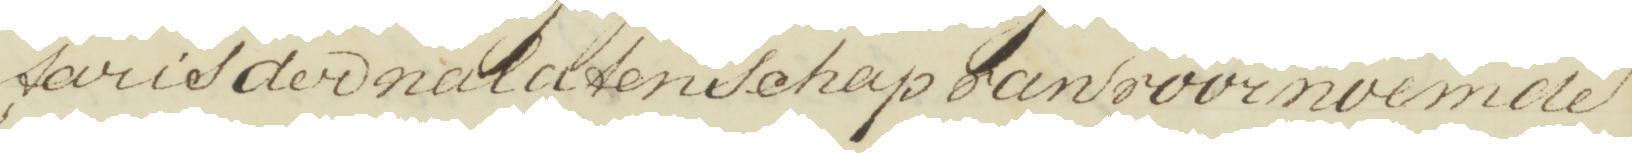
taris der nalatenschap van voornoemde
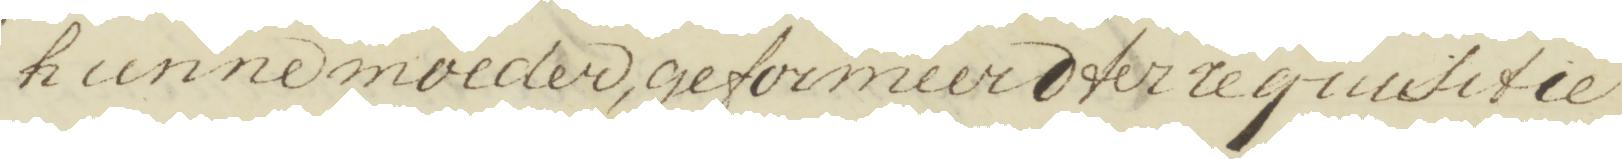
hunne moeder, geformeerd ter requisitie
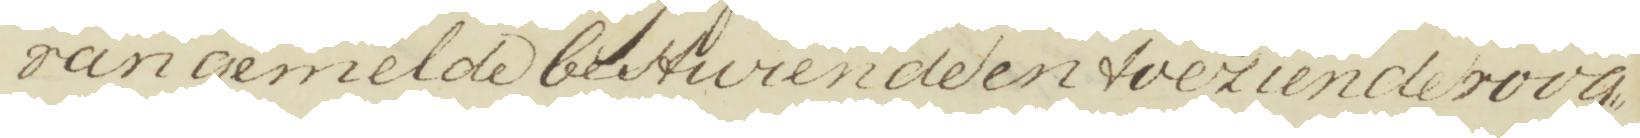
van gemelde besturende en toeziende voog„
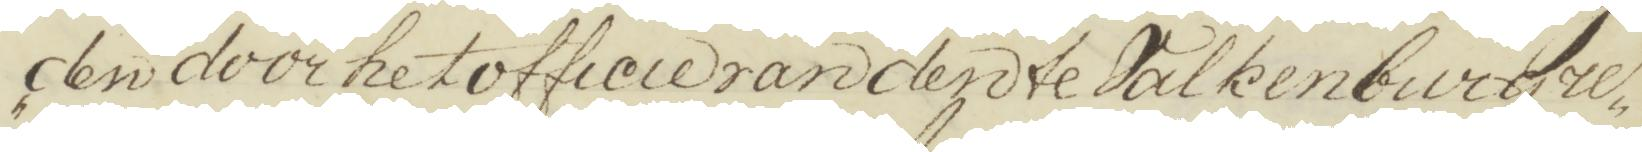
„den door het officie van den te Valkenburt re„
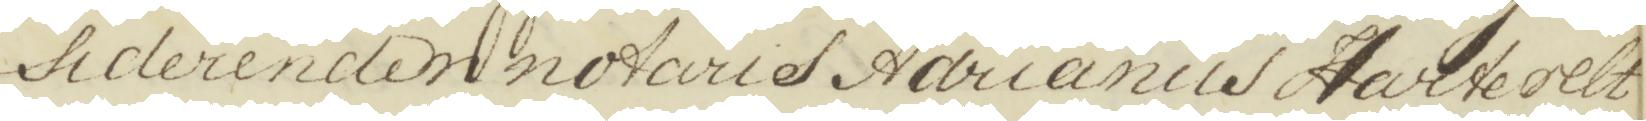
„siderenden notaris Adrianus Hartevelt
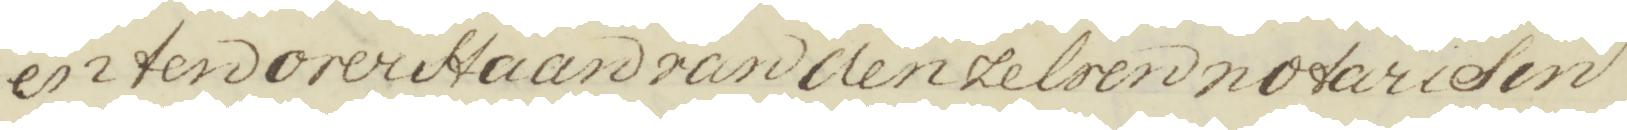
en ten overstaan van den zelven notaris in
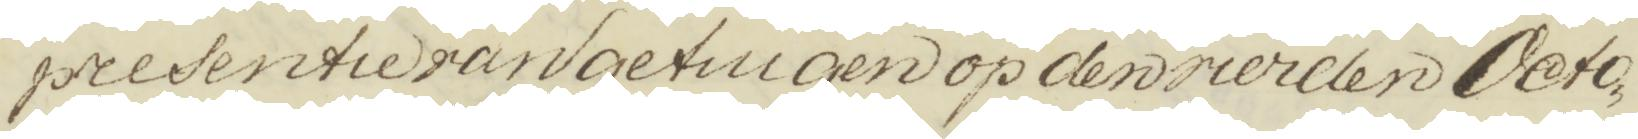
presentie van getuigen op den vierden Octo„
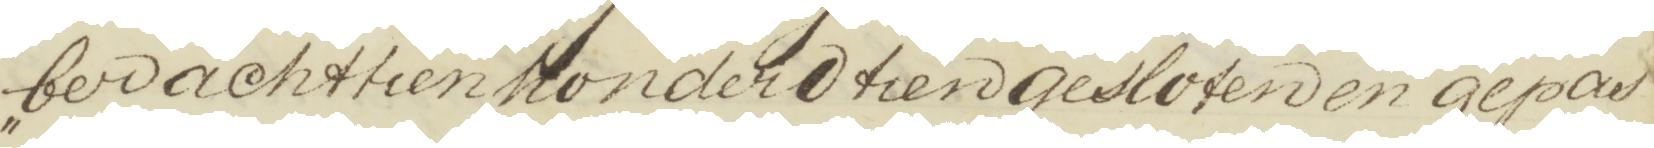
„ber achttien honderd tien gesloten en gepas
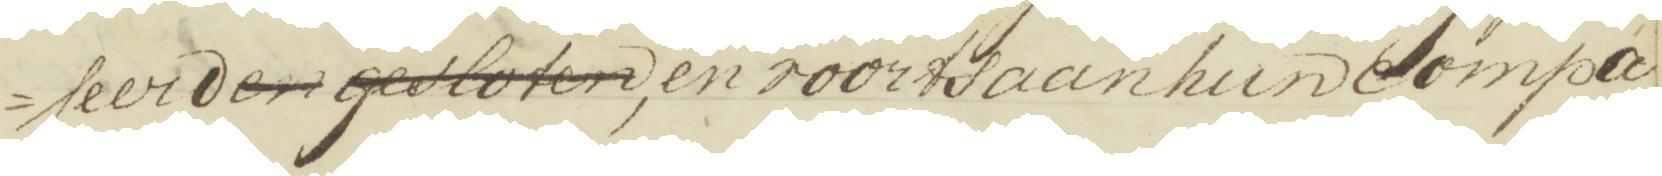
=seerd en gesloten, en voorts aan hun Compa
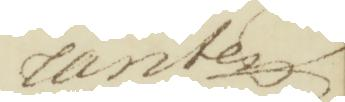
ranten
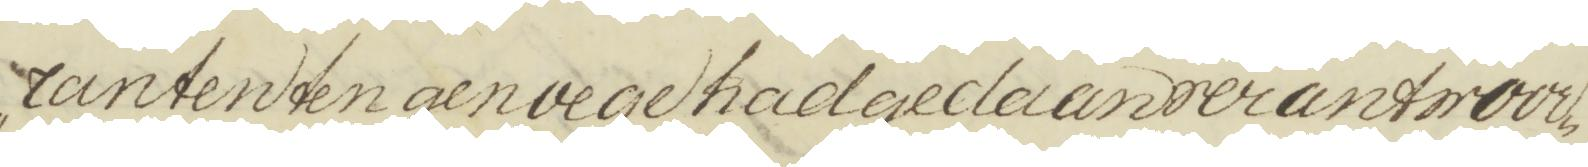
ranten en genoege had gedaan verantwoor„
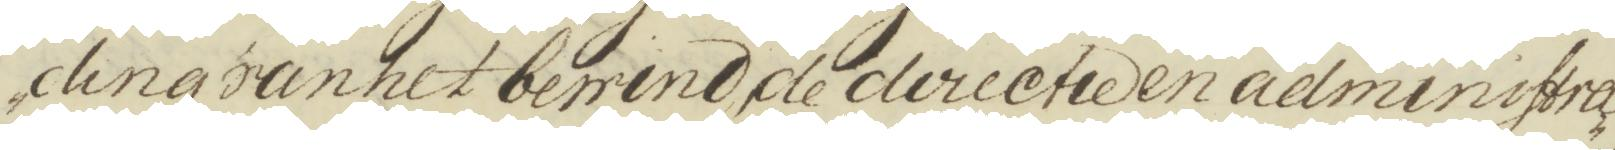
„ding van het bewind, de directie en administra„
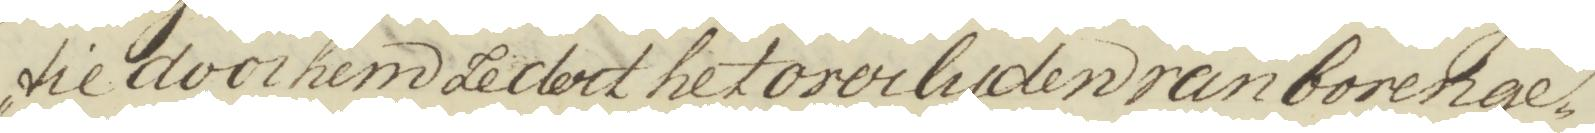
„tie door hem sedert het overlijden van bovenge„
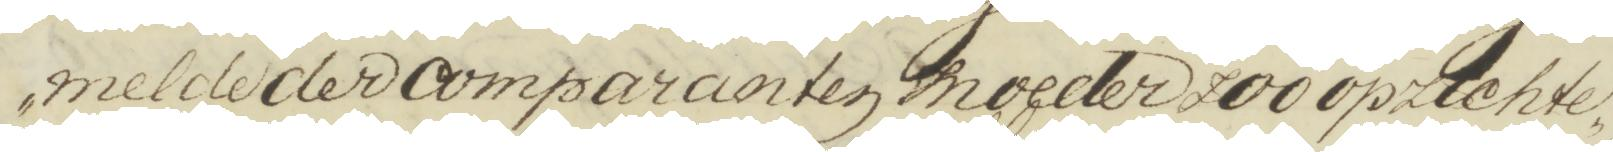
„melde der comparanten moeder zoo opzichte„
